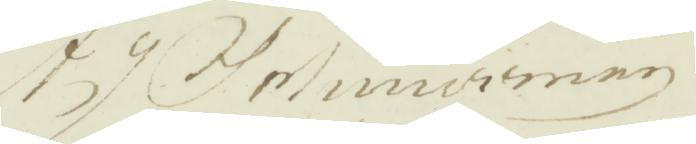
A J S Muurman
